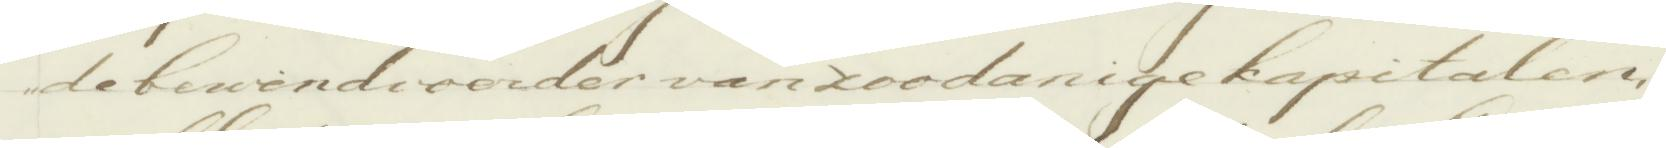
„de bewindvoerder van zoodanige kapitalen,
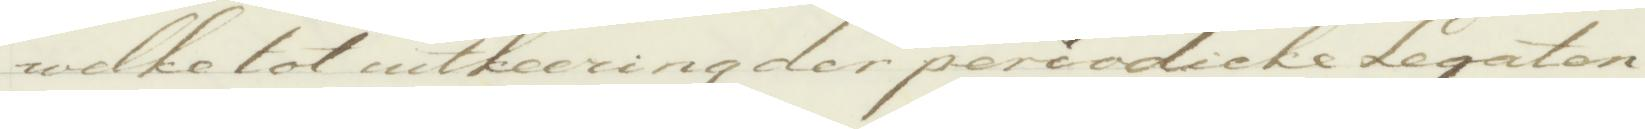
welke tot uitkeering der periodieke Legaten
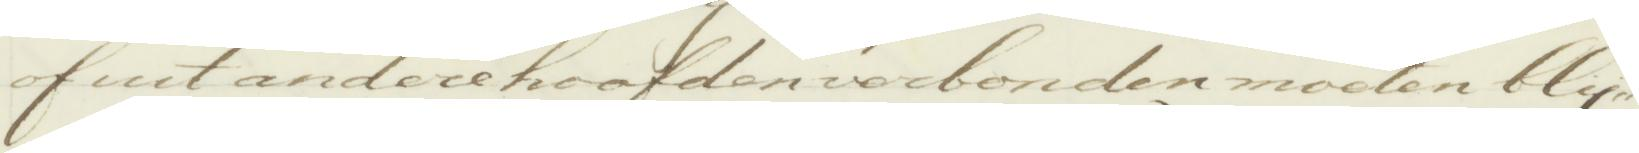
of uit andere hoofden verbonden moeten blij„
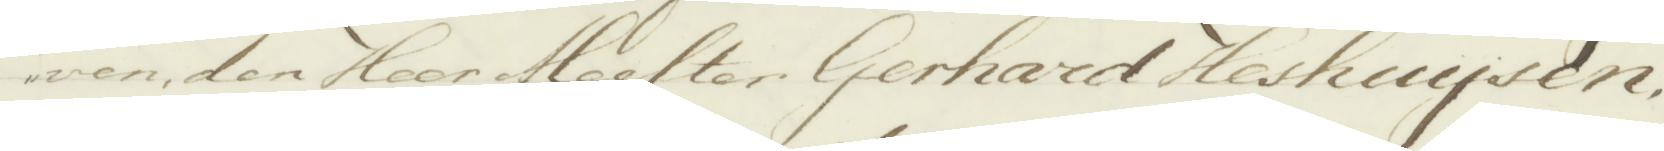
„ven, den Heer Meester Gerhard Heshuijsen,
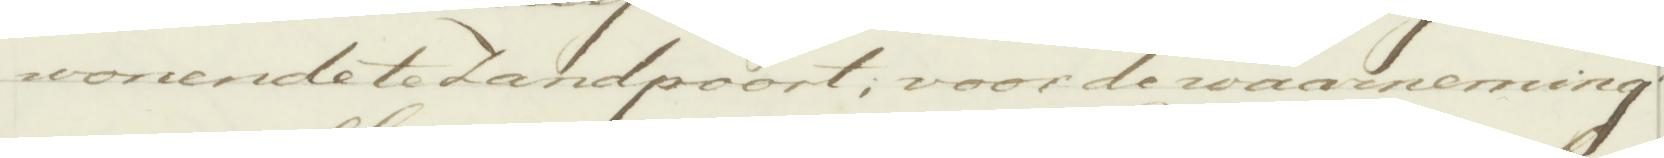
wonende te Zandpoort; voor de waarneming
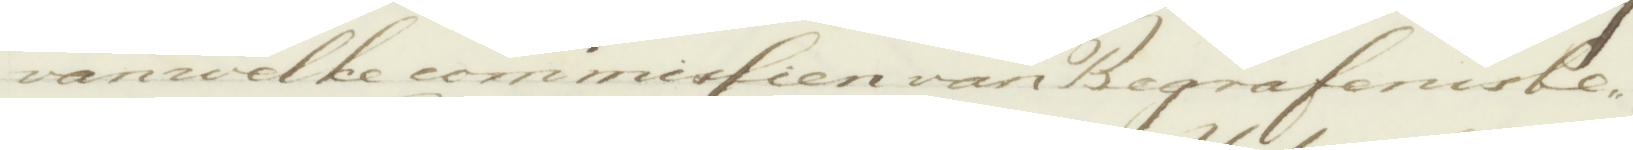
van welke commissien van Begrafenisbe„
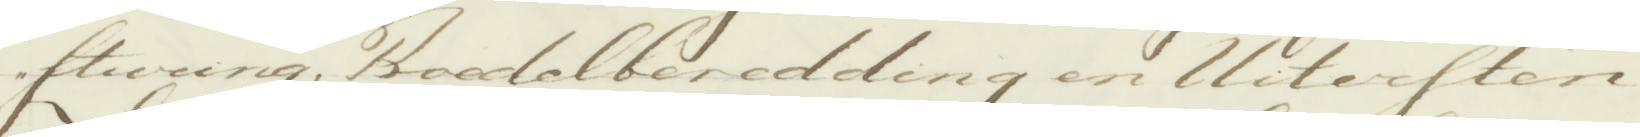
„sturing, Boedelberedding en Uitersten
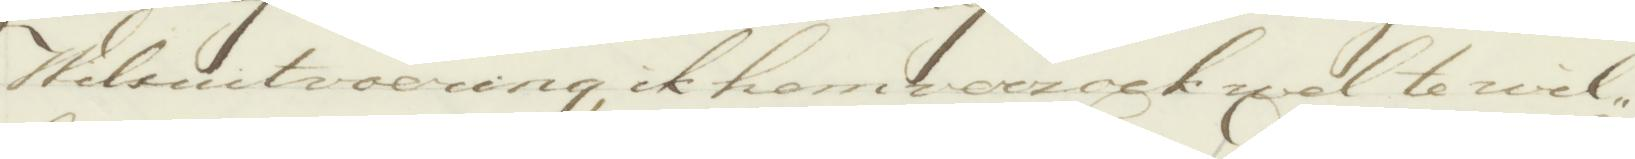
Wilsuitvoering, ik hem verzoek wel te wil„
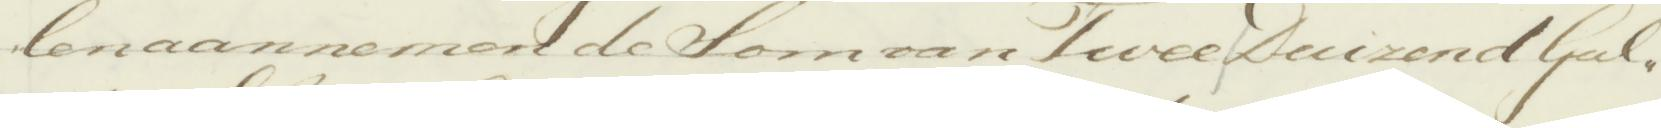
„len aannemen de som van Twee|Duizend Gul„
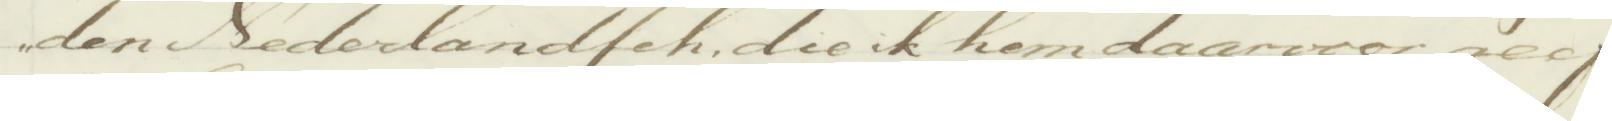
„den Nederlandsch, die ik hem daarvoor geef
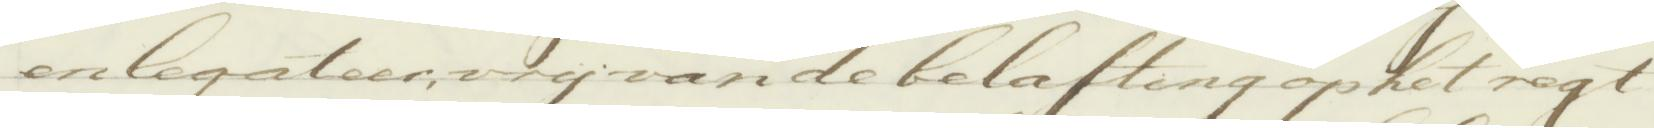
en legateer, vrij van de belasting op het regt
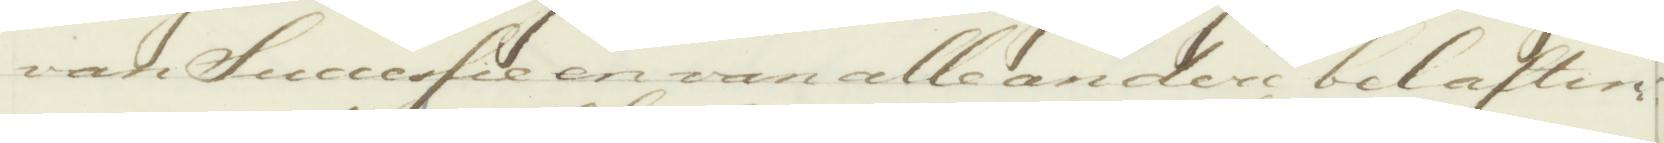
van successie en van alle andere belastin„
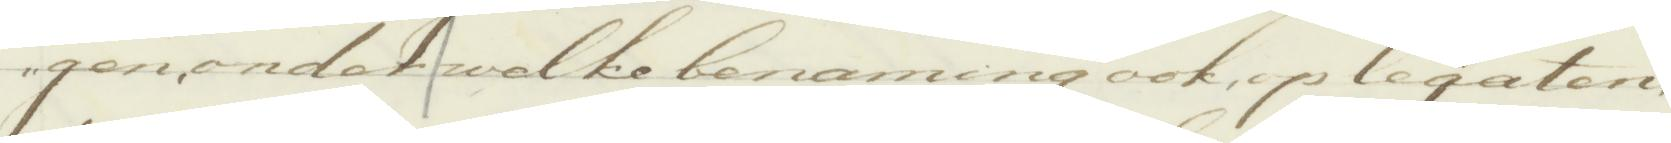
„gen, onder|welke benaming ook, op legaten,
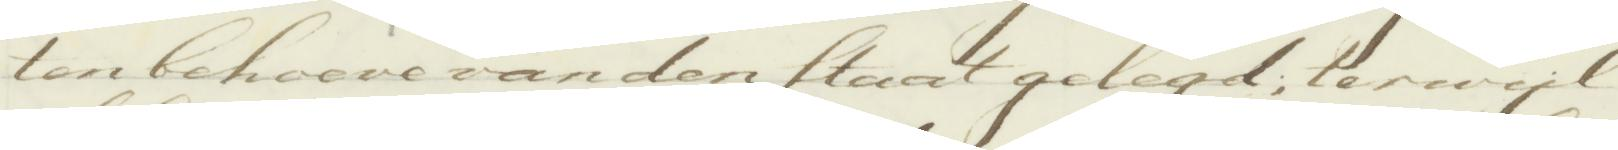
ten behoeve van den staat gelegd; terwijl
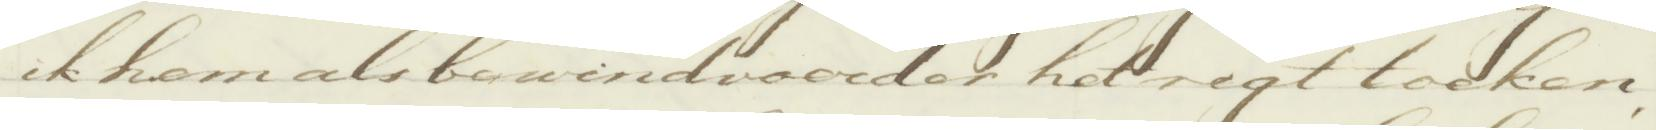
ik hem als bewindvoerder het regt toeken,
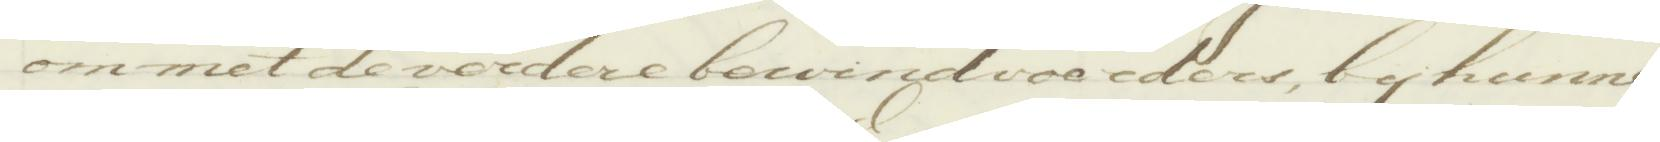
om met de verdere bewindvoerders, bij hunne
